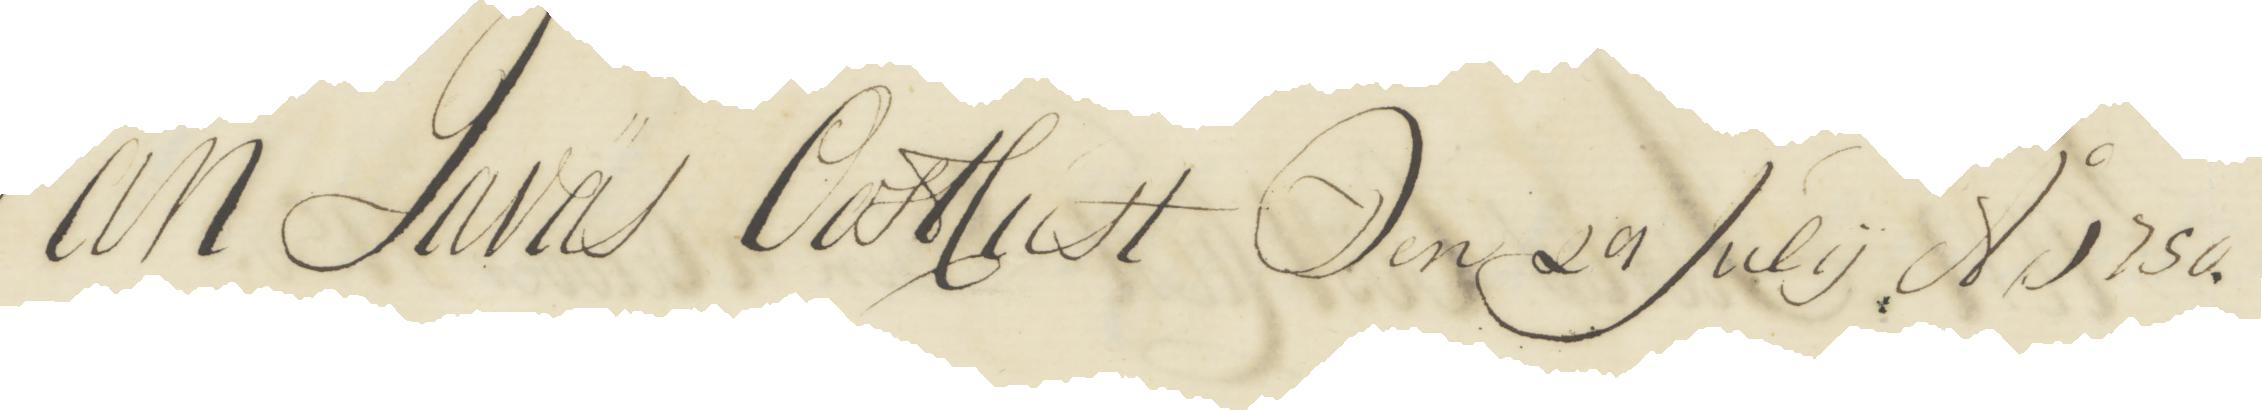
Van Javâs Oost Cust Den 24 Julij A„o 1750.
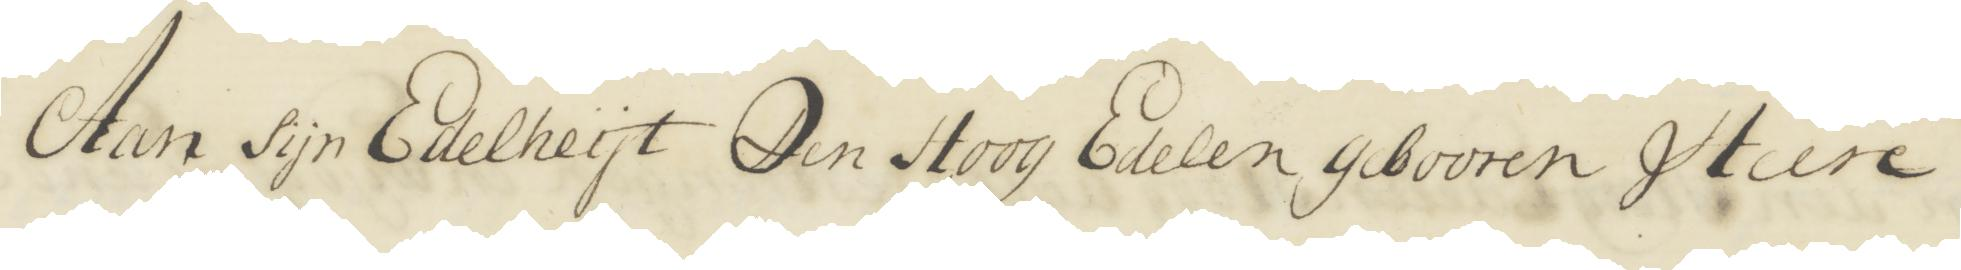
Aan sijn Edelheijt Den Hoog Edelen gebooren Heere
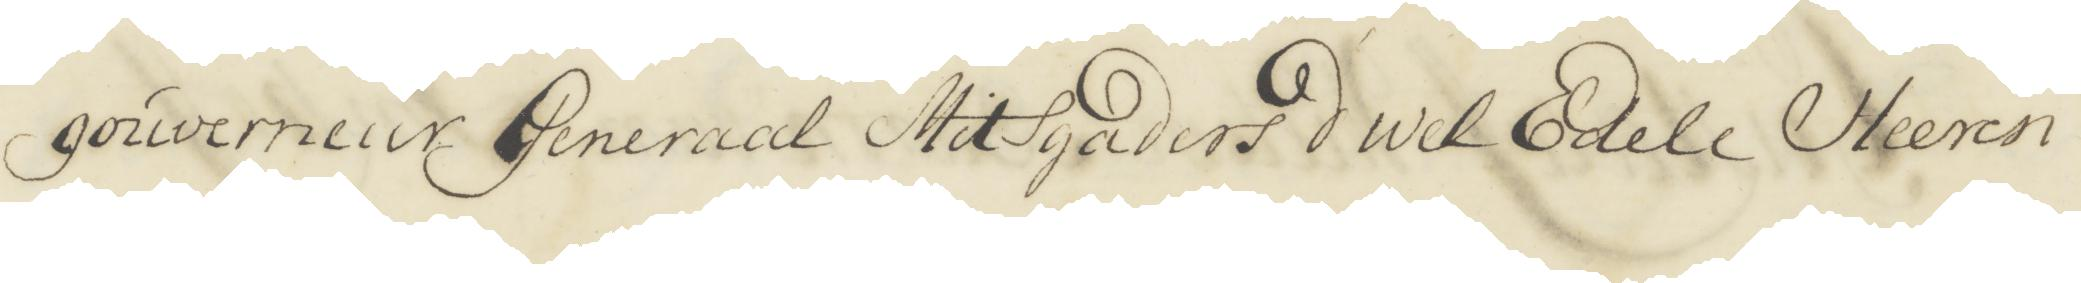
gouverneur Generaal Mitsgaders d' wel Edele Heeren
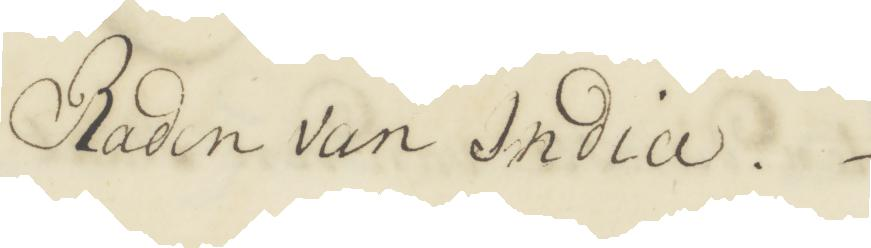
Raden van Jndia.
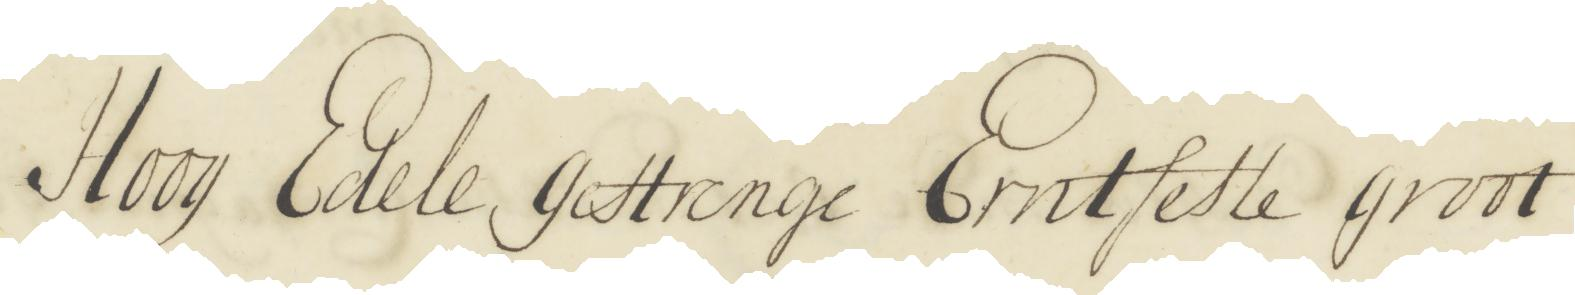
Hoog Edele gestrenge Erntfeste groot
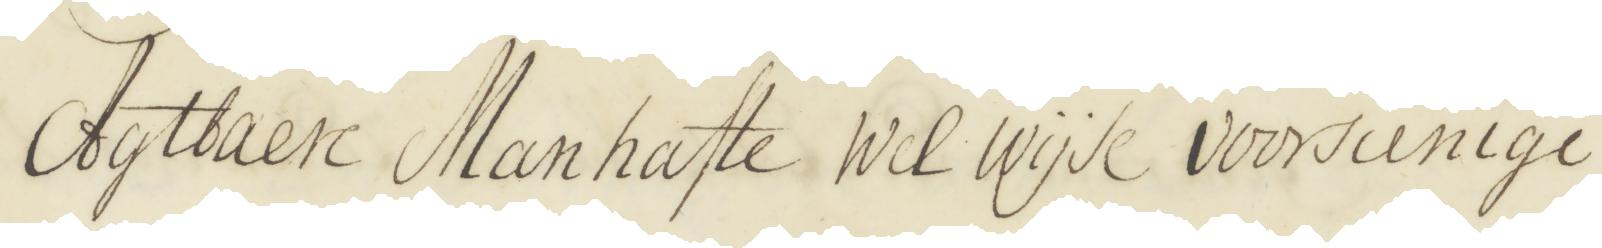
Agtbaere Manhafte wel wijse voorsienige
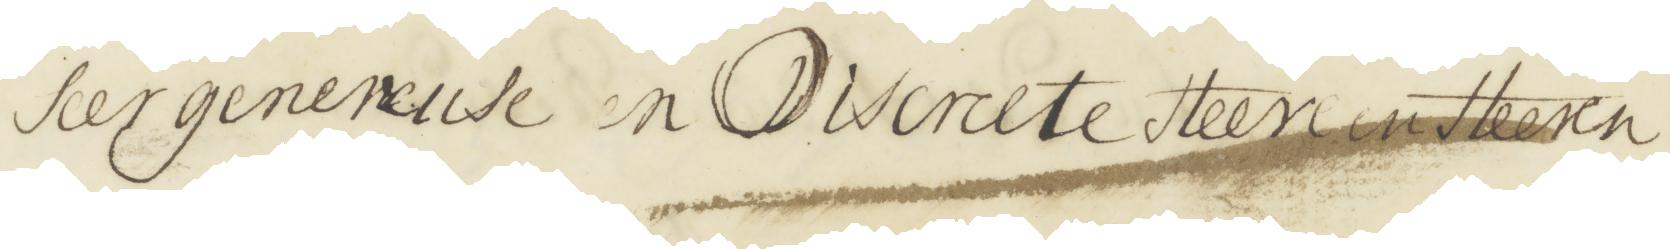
seer genereuse en Discreete Heere en Heeren
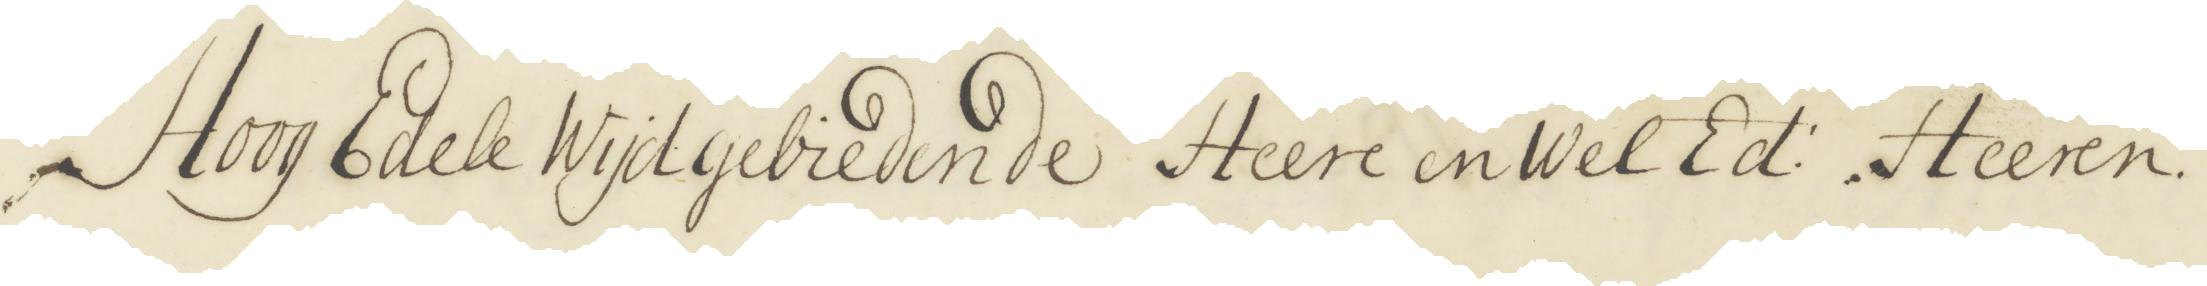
Hoog Edele Wijdgebiedende Heere en wel Ed: Heeren.
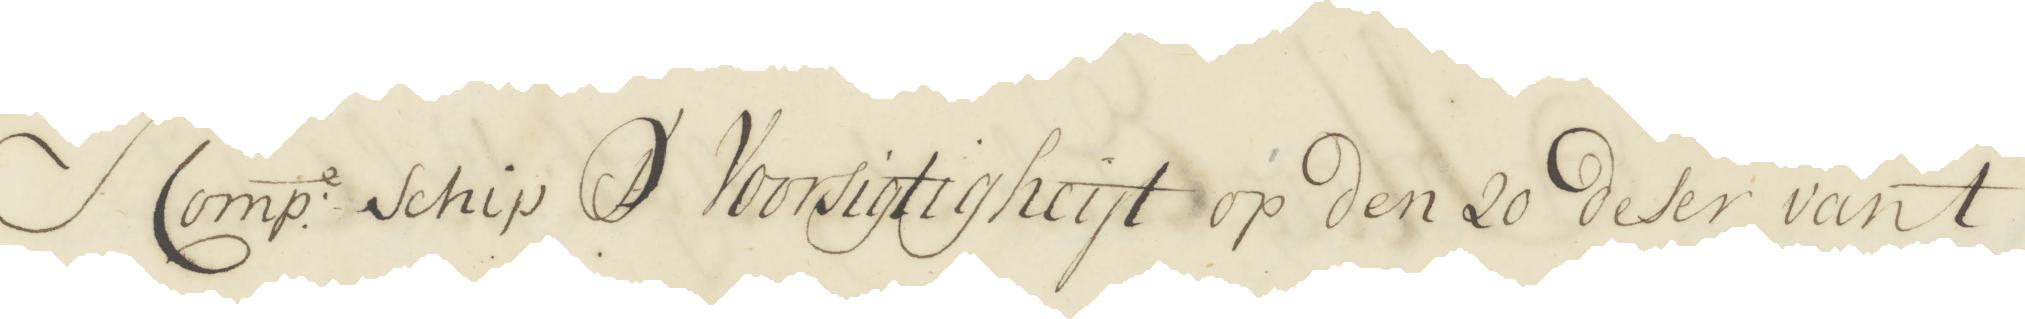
'T Comp:e schip D' Voorsigtigheijt op den 20 deser van’t
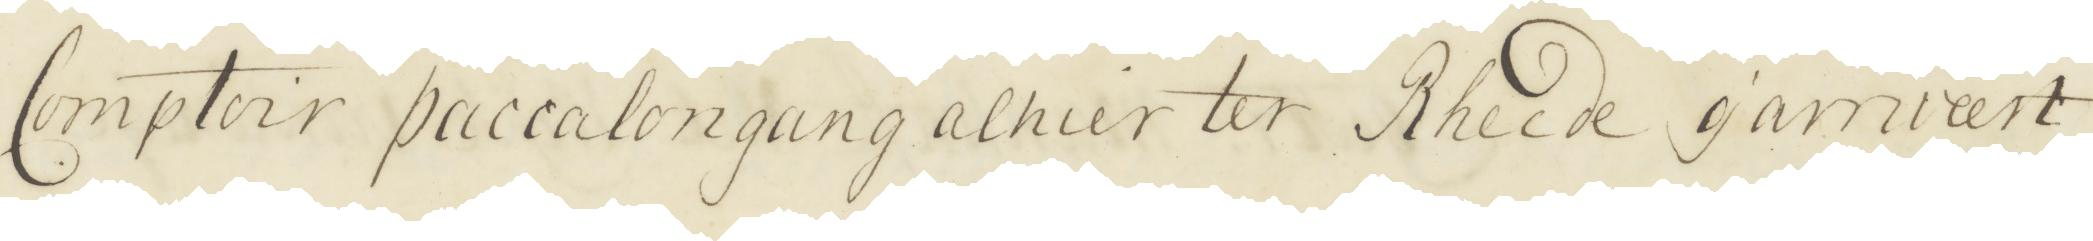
Comptoir paccalongang alhier ter Rheede g'arriveert
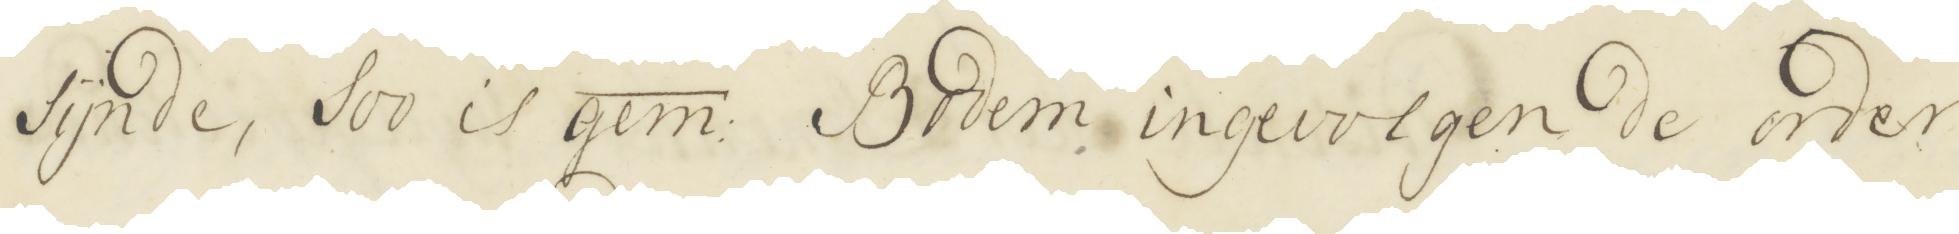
sijnde, soo is gem: Bodem ingevolgen de order
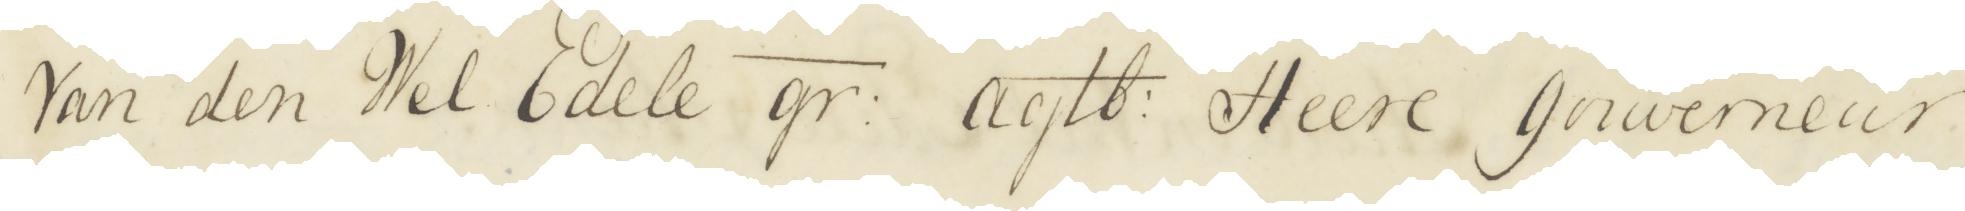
van den Wel Edele gr: agtb: Heere gouverneur
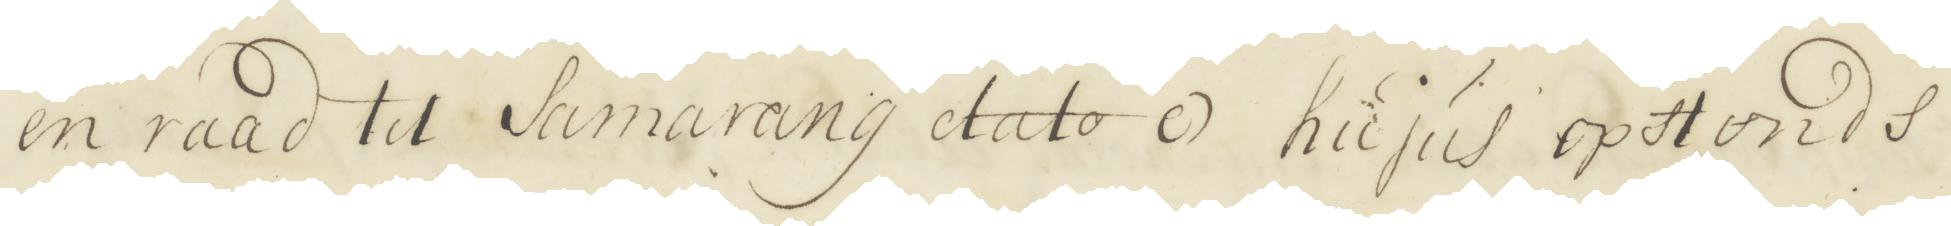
en raad tot samarang dato en hujus opstonds
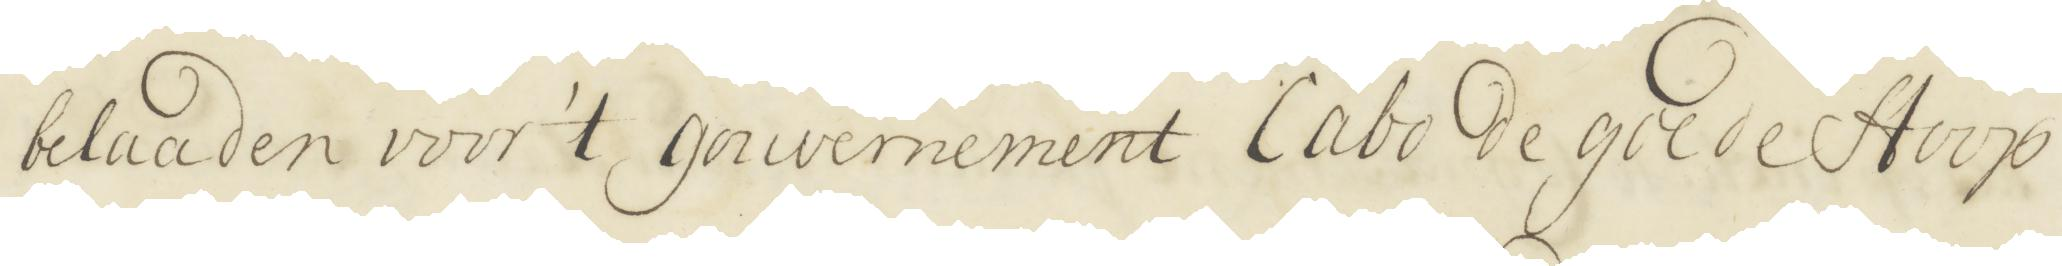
belaaden voor ’t gouvernement Cabo de goede Hoop
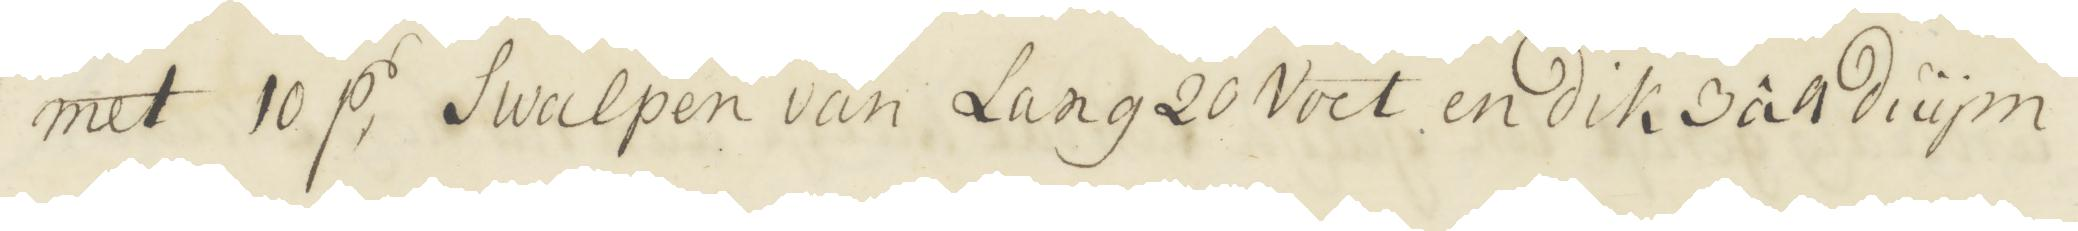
met 10 p„s swalpen van Lang 20 voet en dik 3 â 4 duijm
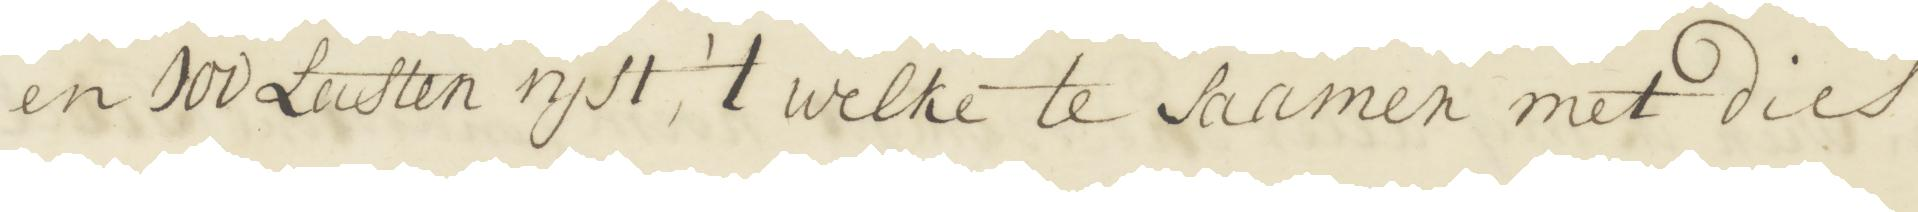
en 100 Lasten rijst, ’t welke te saamen met dies
